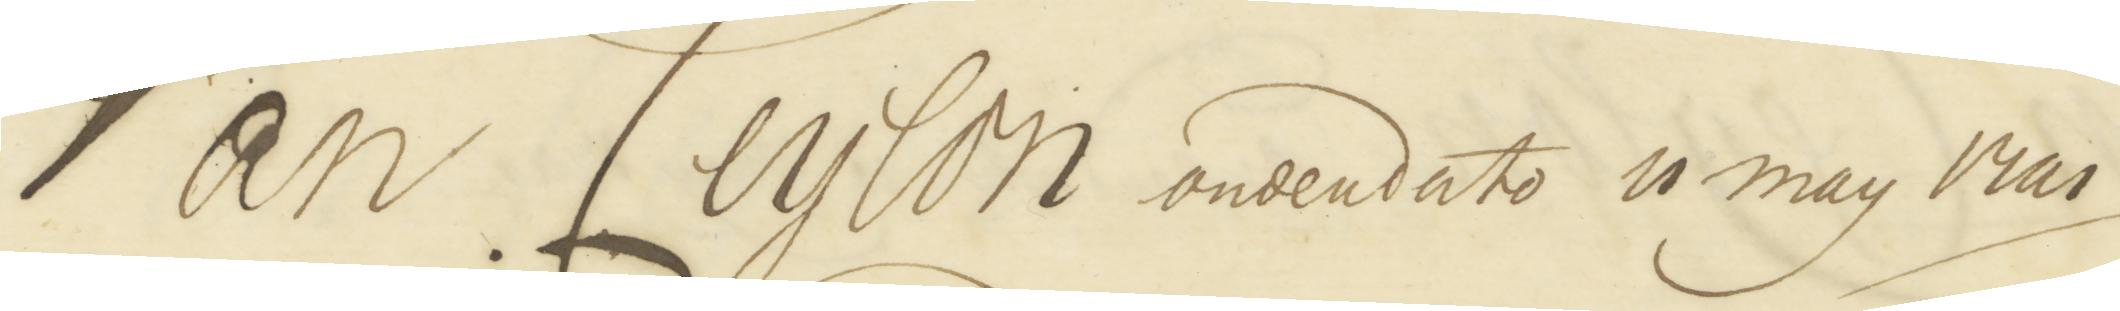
Van Ceijlon onder dato 11 maij 1741
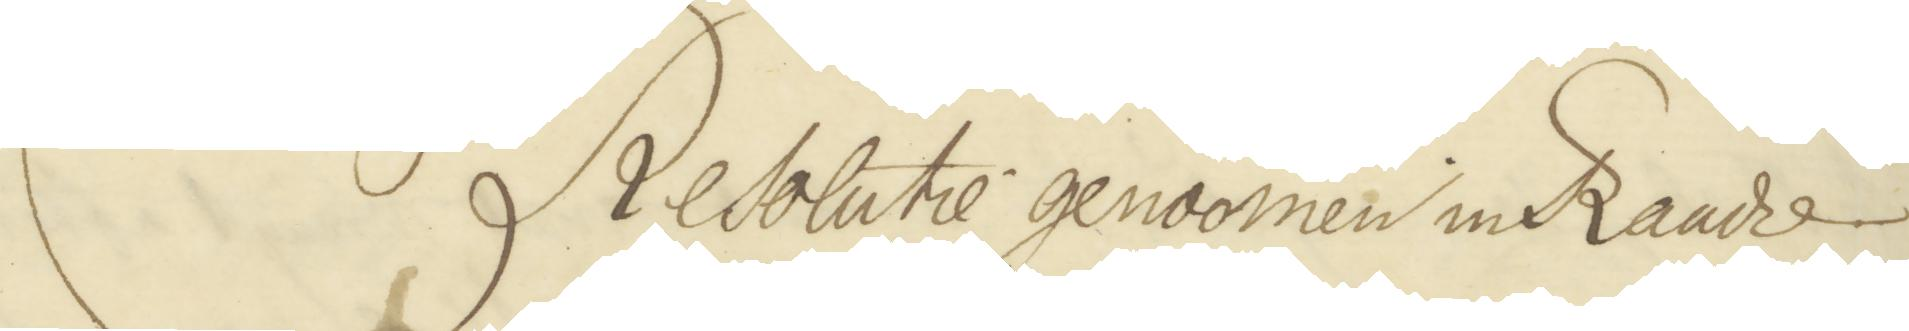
Resolutie genoomen in Raade
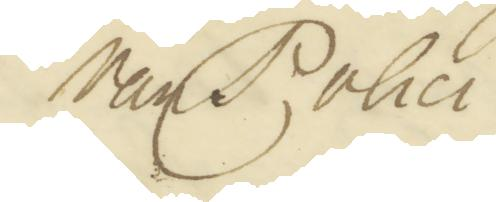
van Polici
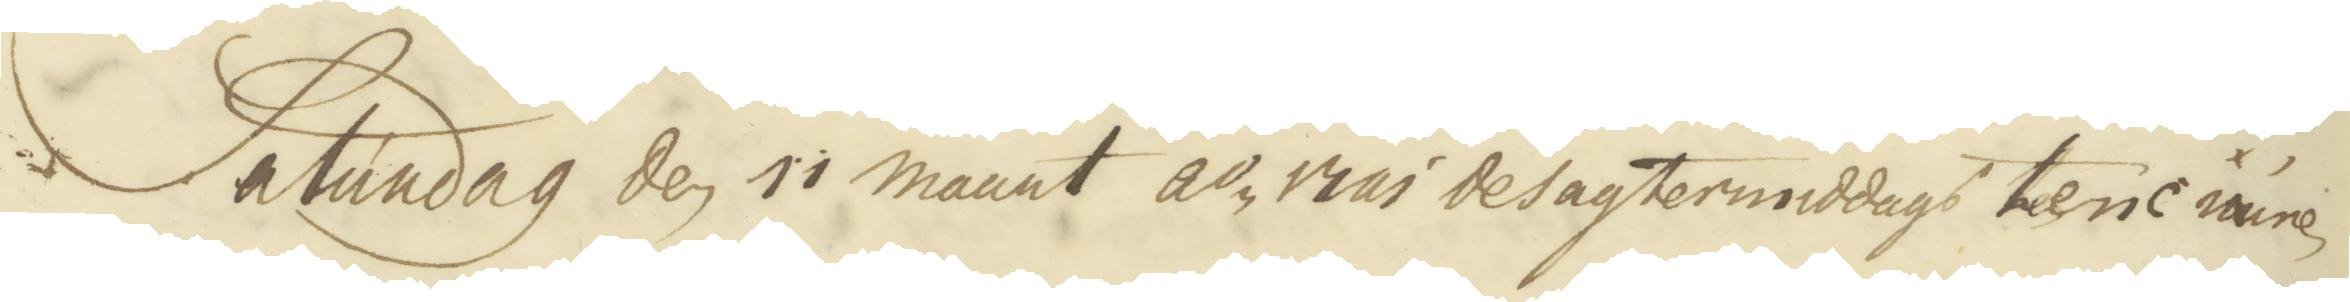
Saturdag den 11 maart a„o 1741 des agtermiddags ten 5 uuren
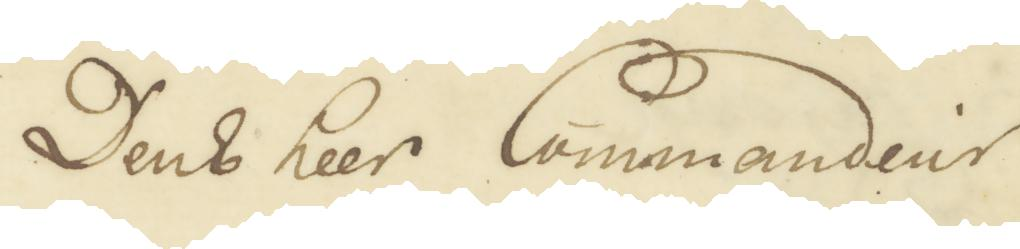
Den E heer Commandeur
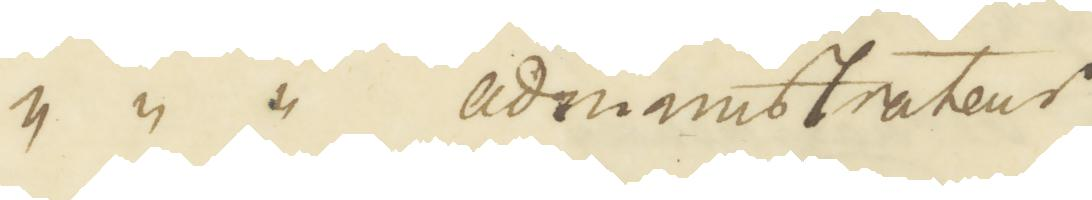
„ „ „ administrateur
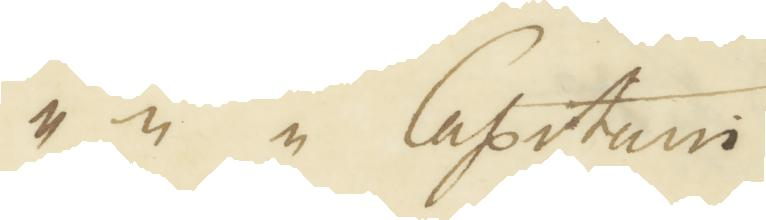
„ „ „ Capitain
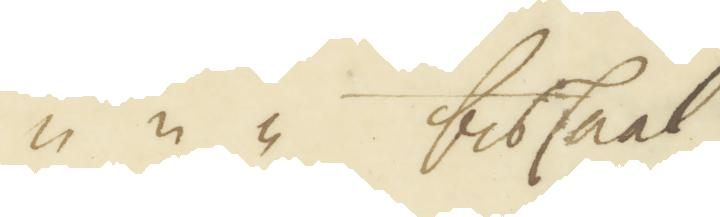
„ „ „ fiscaal
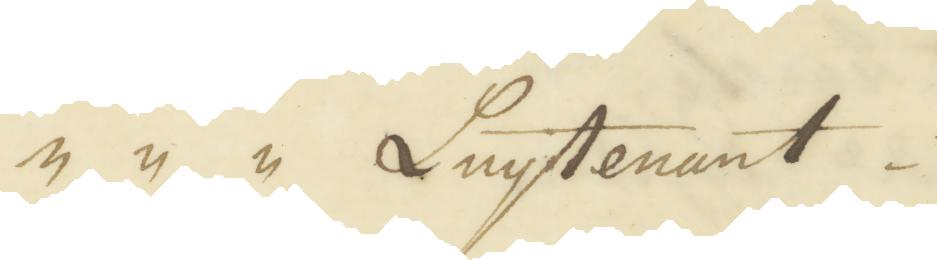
„ „ „ Luytenant
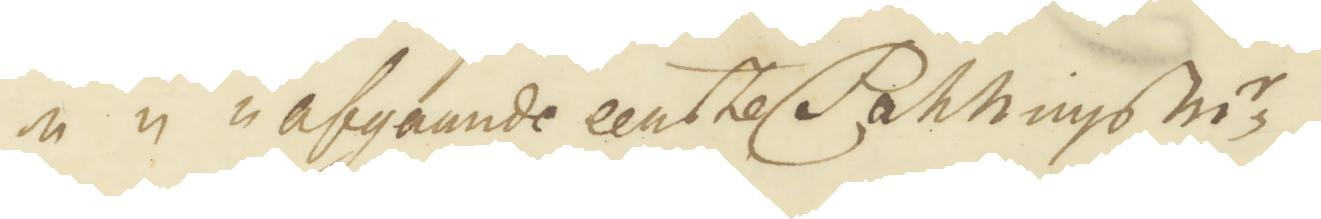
„ „ „ afgaande eerste Pakhuijsm„r
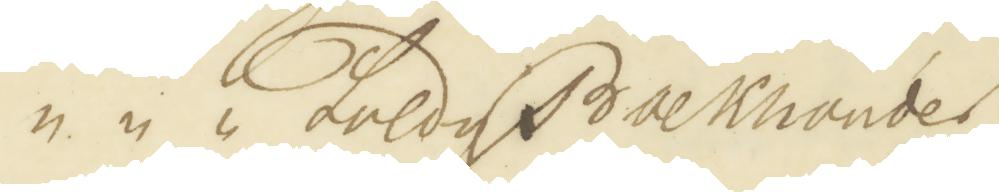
„ „ „ soldy Boekhouder
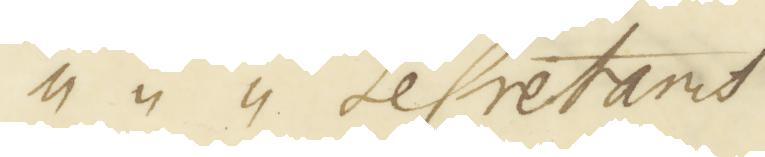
„ „ „ secretaris
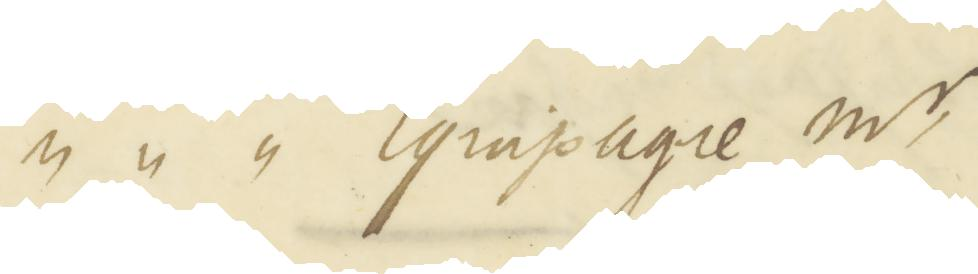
„ „ „ Equipagie m,r
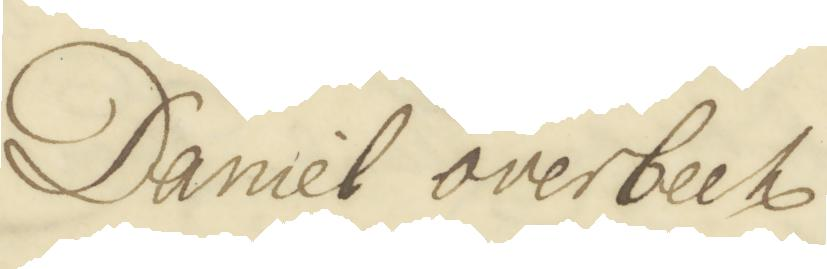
Daniël overbeek
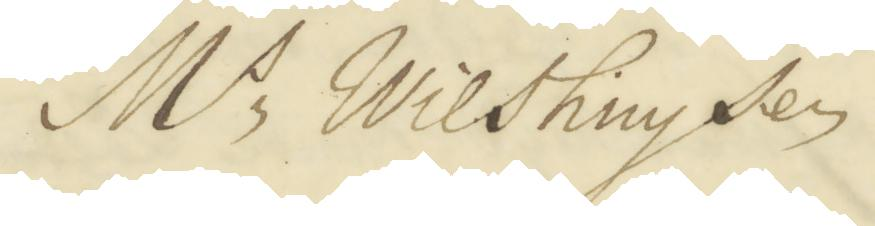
M„s Wilshuysen
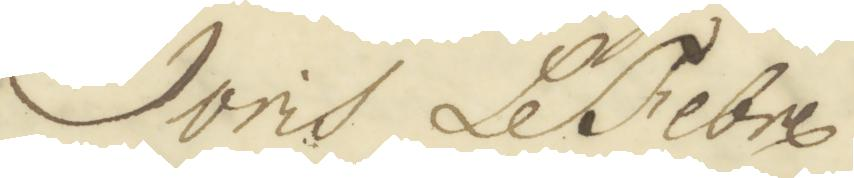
Ioris Le Feber
